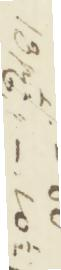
13 pC=t „-.10½
